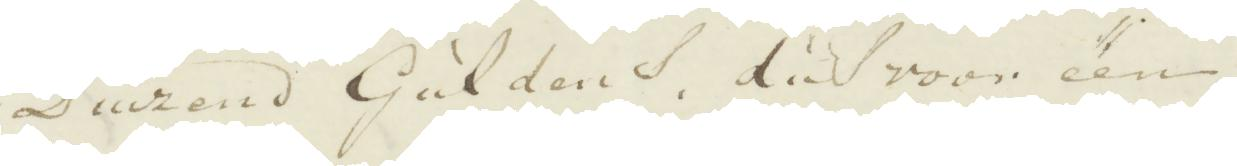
Duizend Guldens, dus voor een
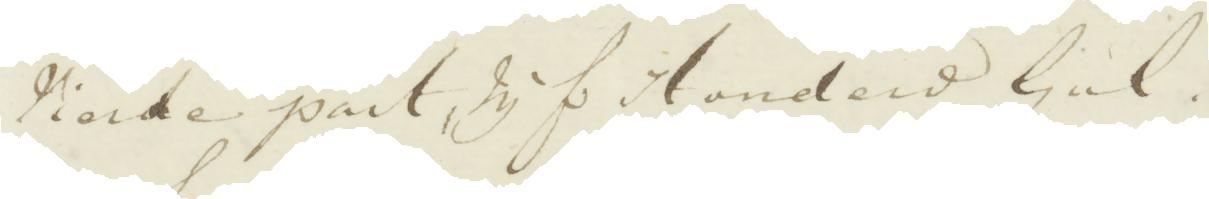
Vierde part, vijf Honderd Gul.
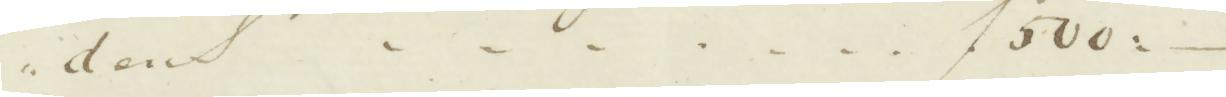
„ dens - - - . - - . ƒ 500:—
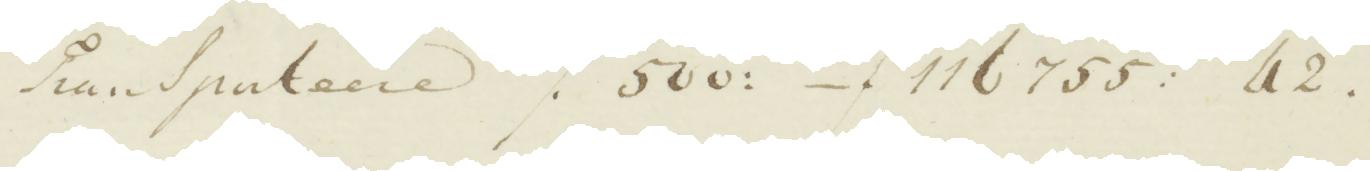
Transporteere ƒ 500: —ƒ 116755: 42.
